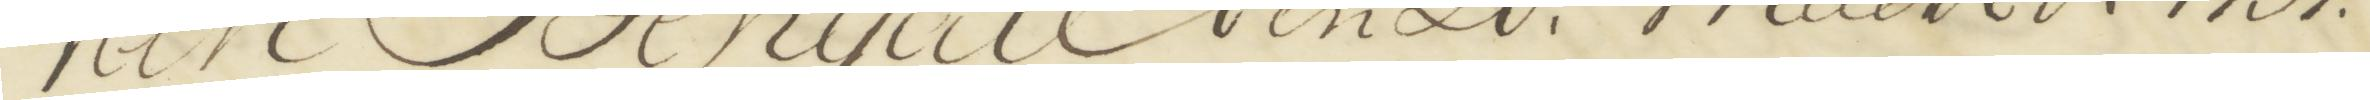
Van Bengale den 20: Maert Ao 1737.
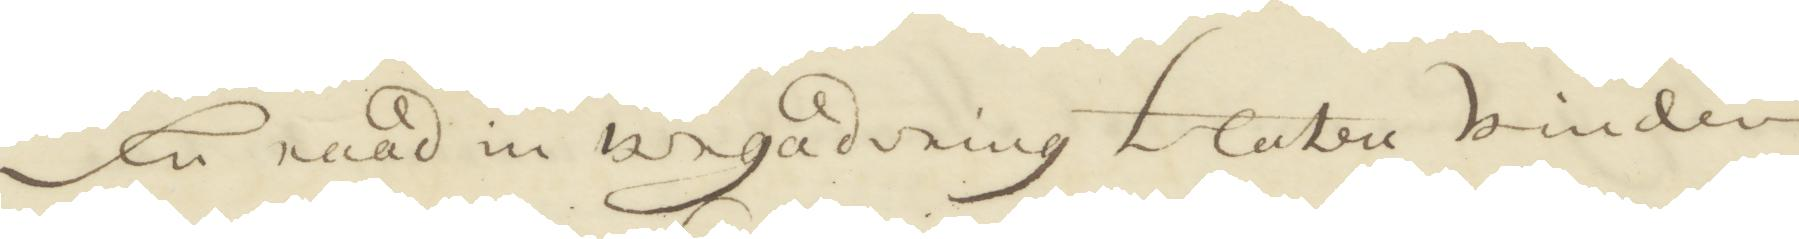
En raad in vergadering telaten vinden
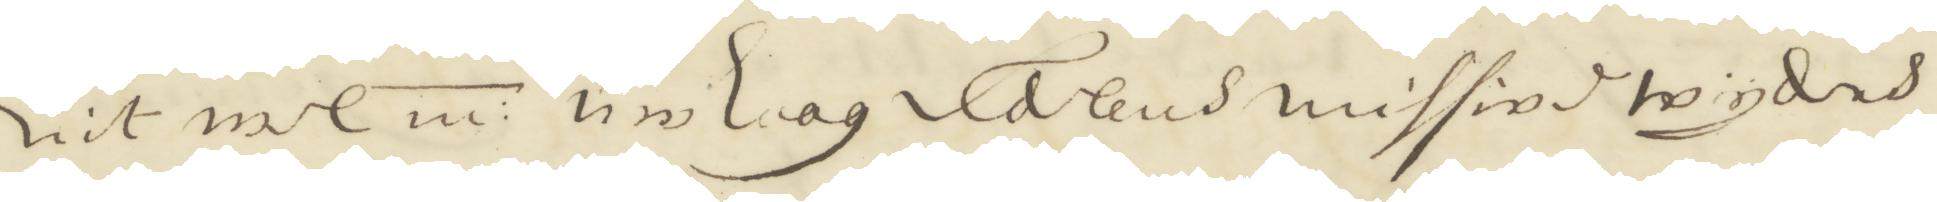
uit wel m: uw hoog Edelens missive wijders
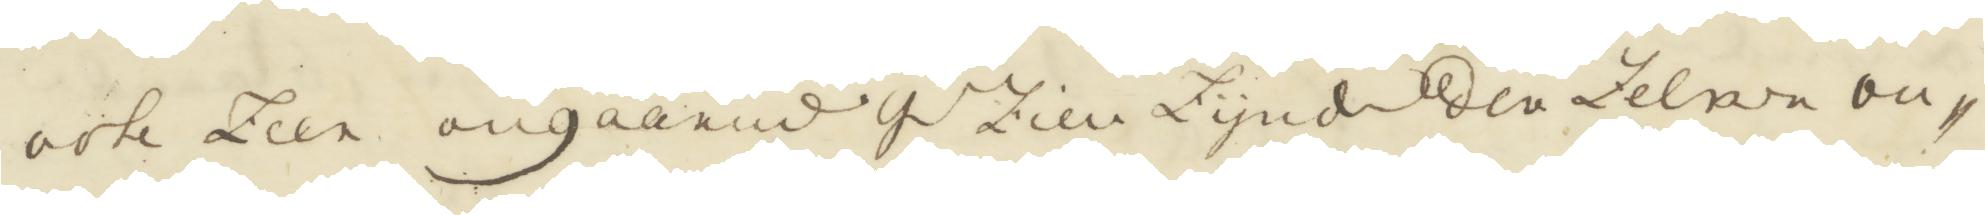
ook zeer ongaarne gezien zijnde der zelver on„
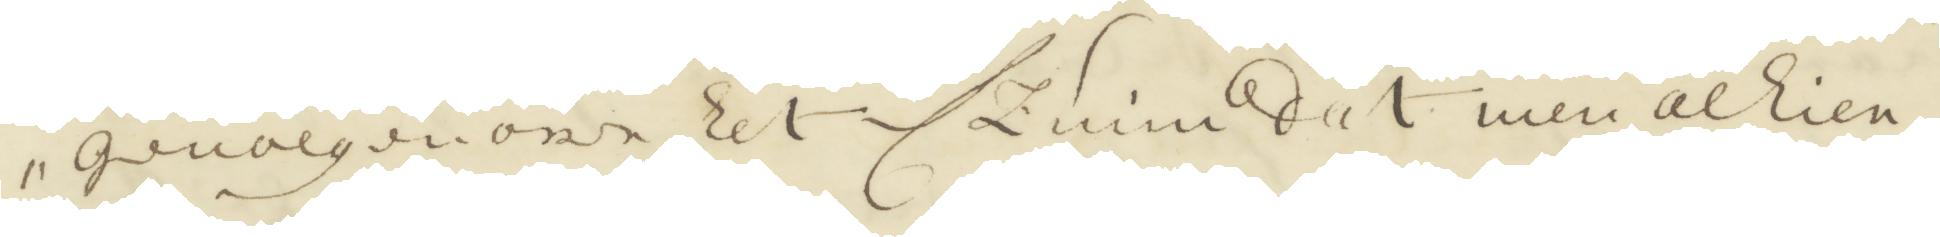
„genoegen over het verzuim dat men alhier
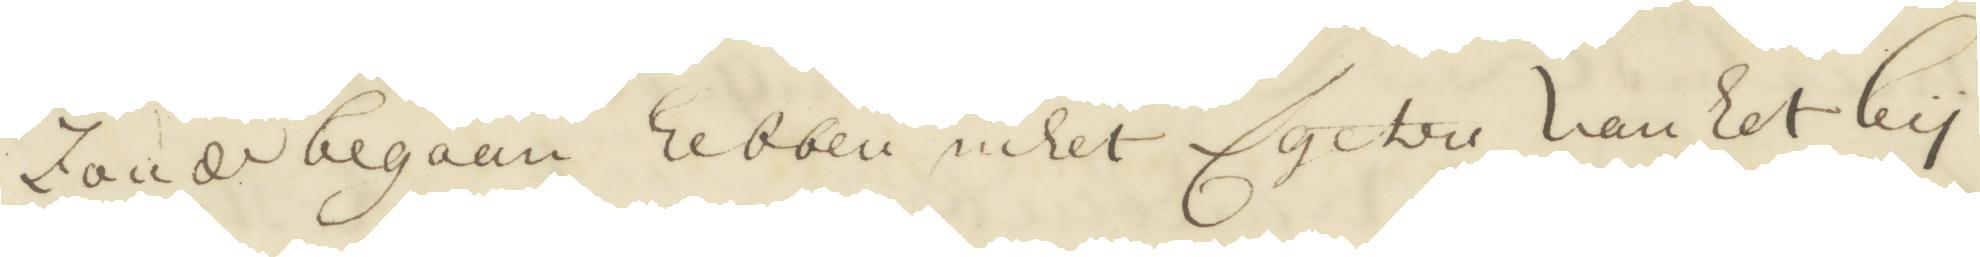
zoude begaan hebben in het vergeten van het bij
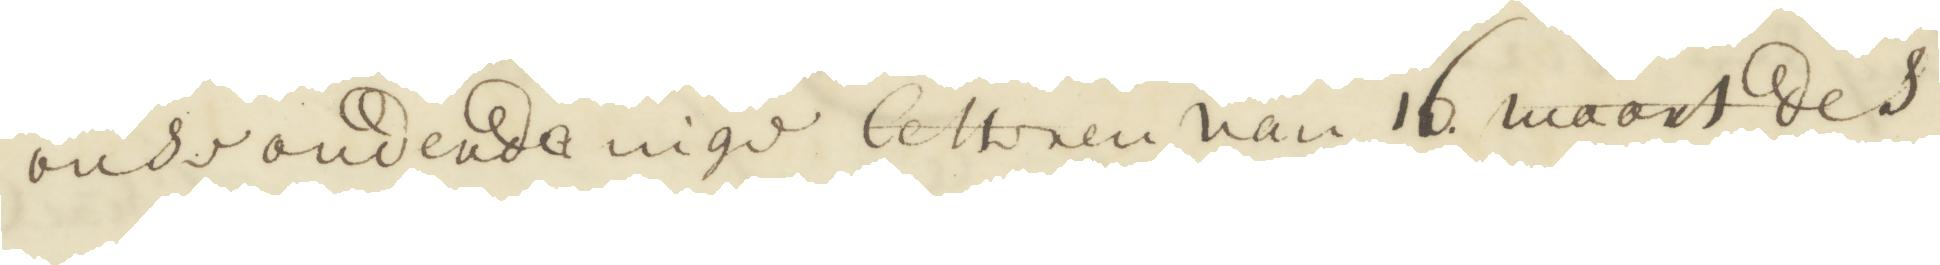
onse onderdanige letteren van 16. maart des
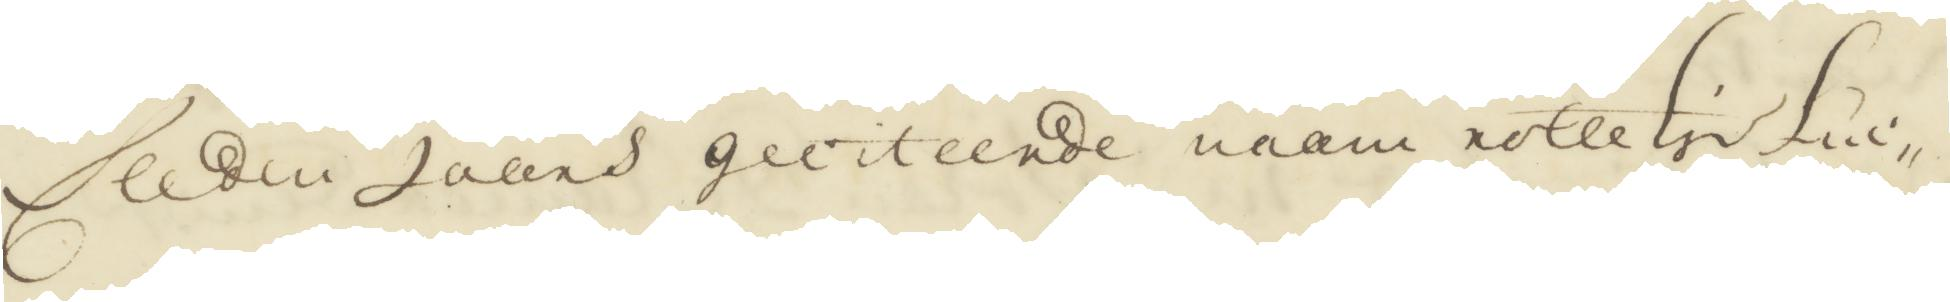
verleden jaars geciteerde naam rolletje suc„
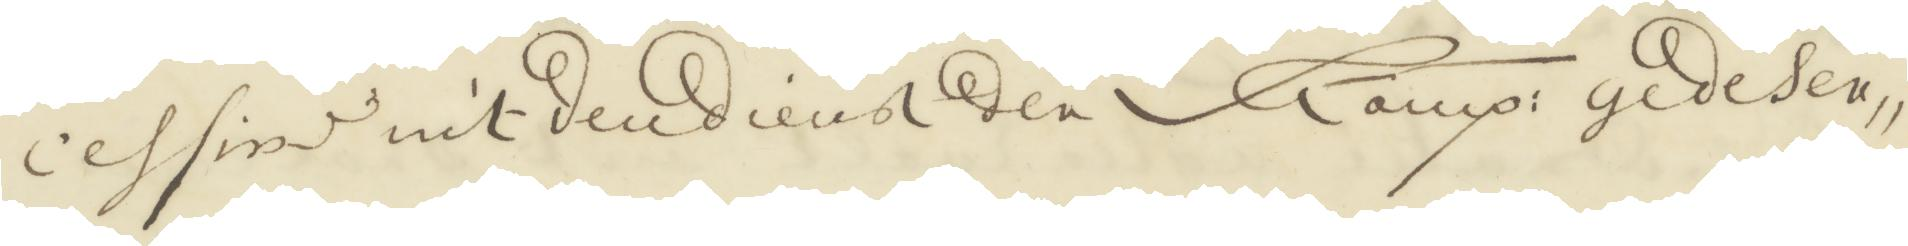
cessive uit den dienst der EComp: gedeser„
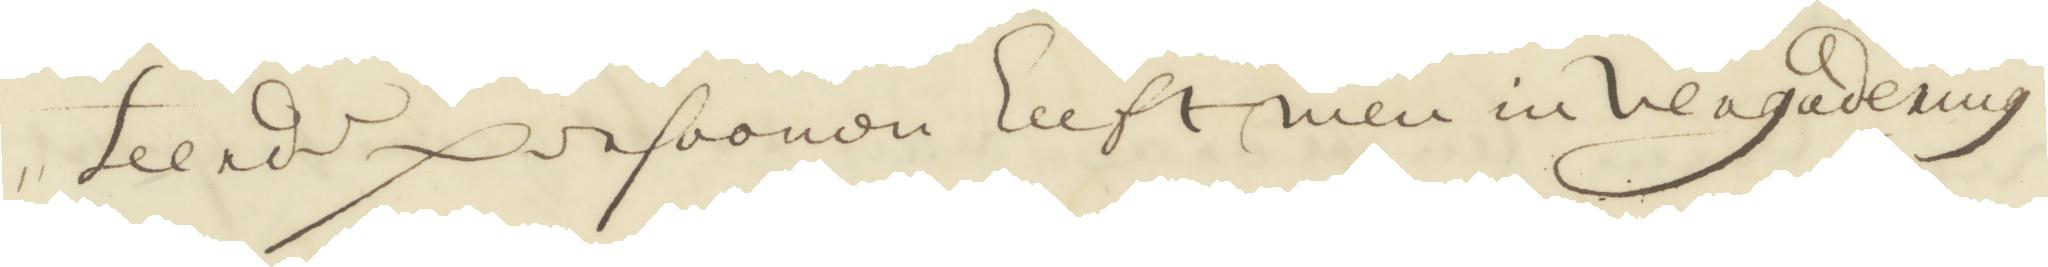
„teerde persoonen heeft men in vergadering
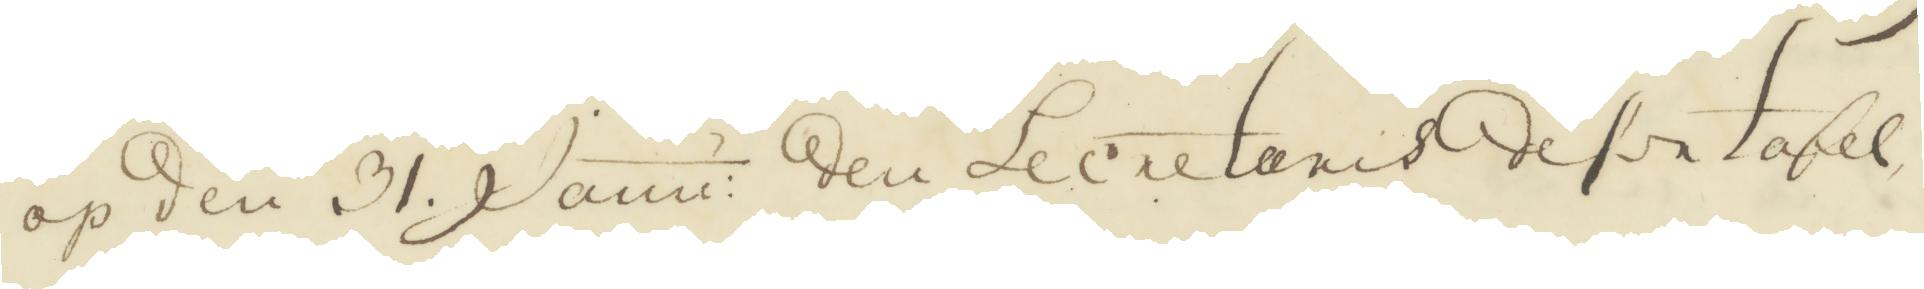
op den 31. Janu: den secretaris deser tafel
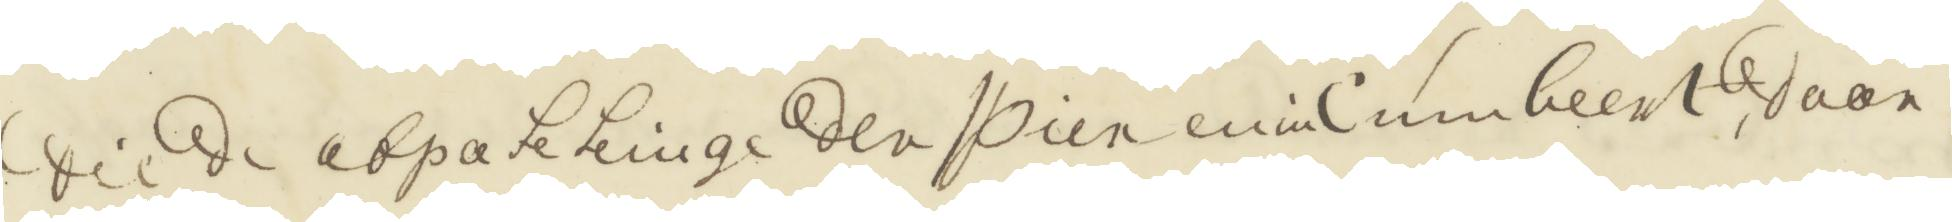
die de afpakkinge der ppier en incumbeert, daar
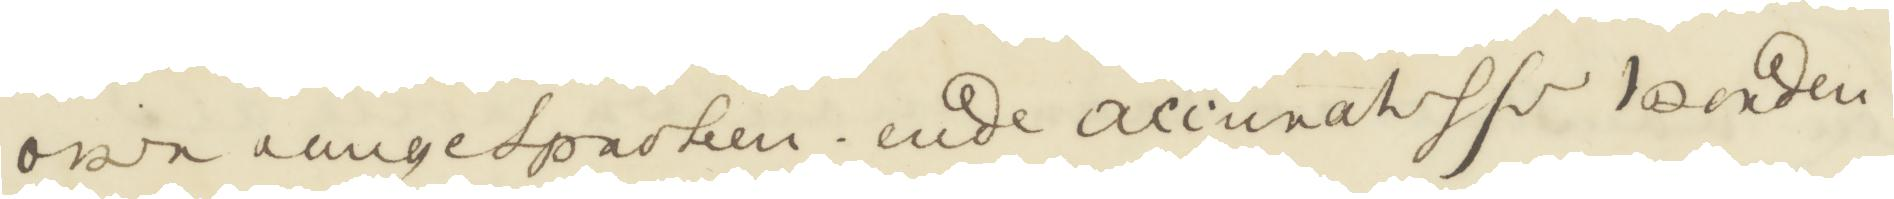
over aangesproken, ende accuratesse worden
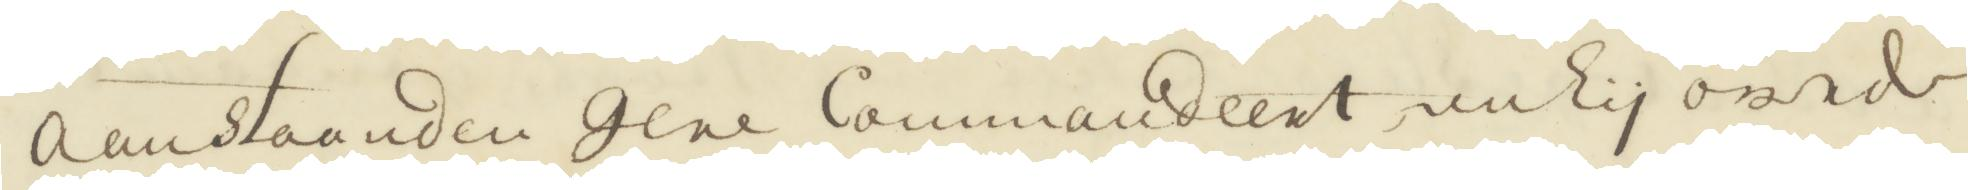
aanstaanden gere commandeert, en hij over de
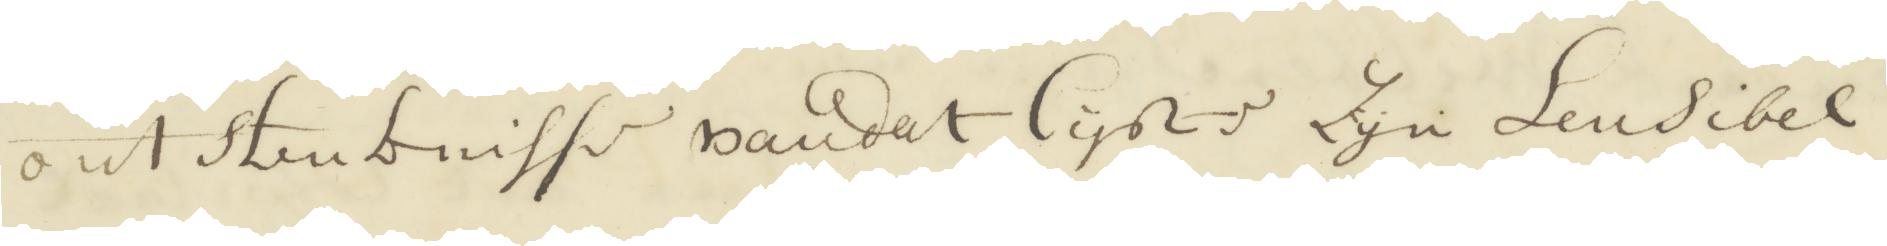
ontstentnisse vandat lijste zijn sensibel
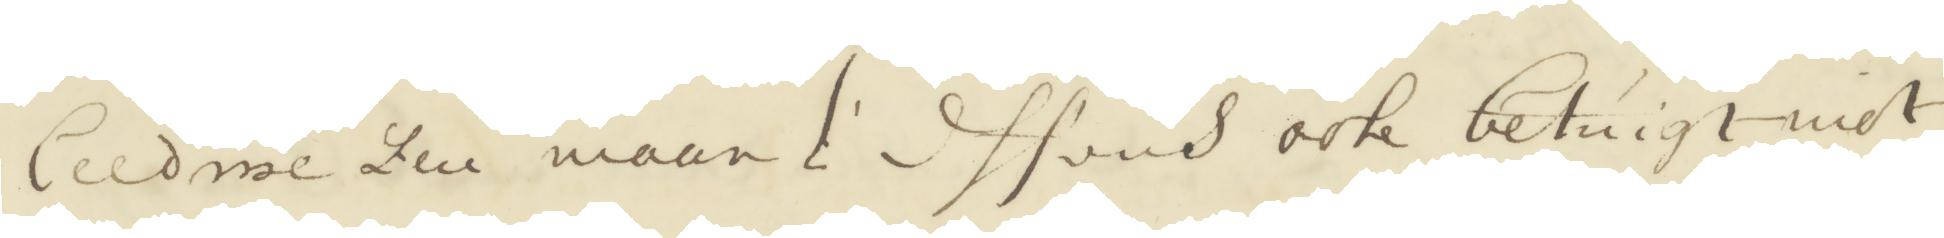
leedwezen maar t' Effens ook betuigt niet
